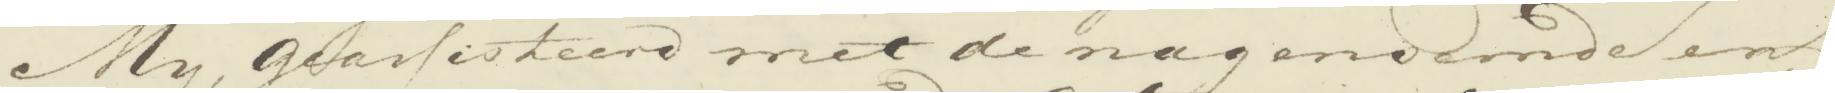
My, geassisteerd met de nagenoemde en
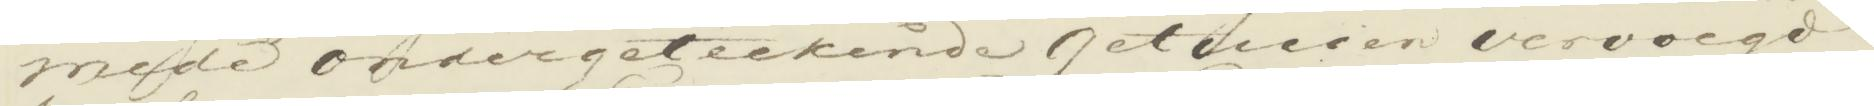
mede ondergeteekende getuigen vervoegd
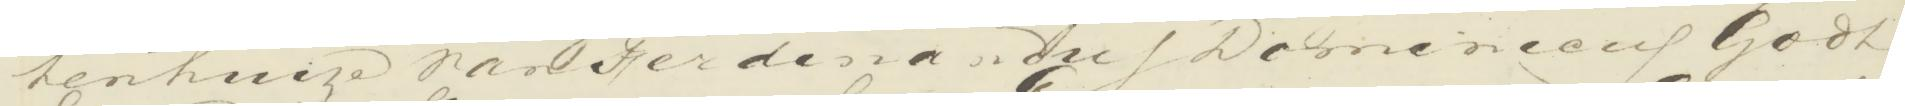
ten huize van Ferdinandus Dominicus Godt
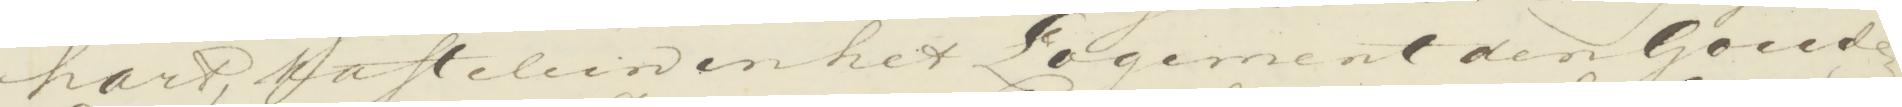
hart, kastelein in het Logiment den Goude
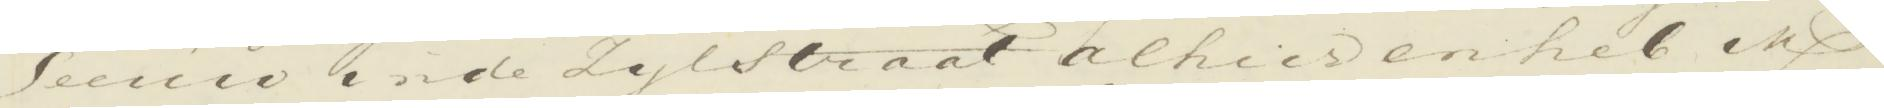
Leeuw in de Zylstraat alhier en heb ik
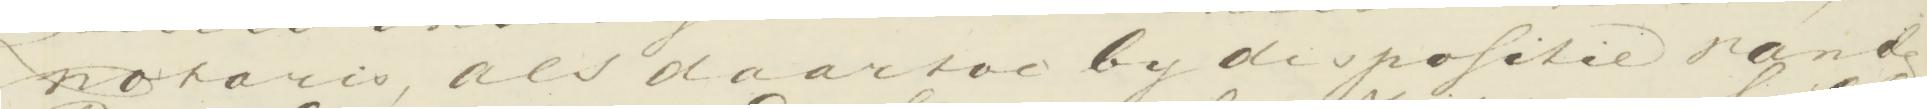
notaris, als daartoe by dispositie van de
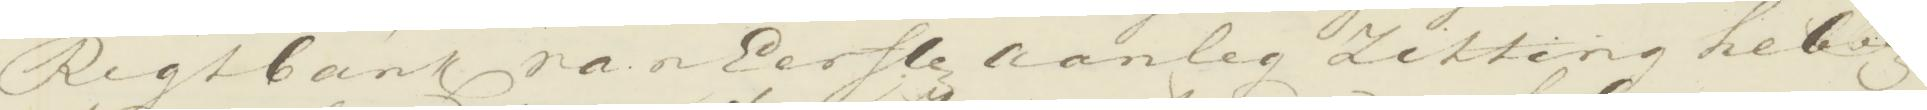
Regtbank van Eerste aanleg zitting hebben
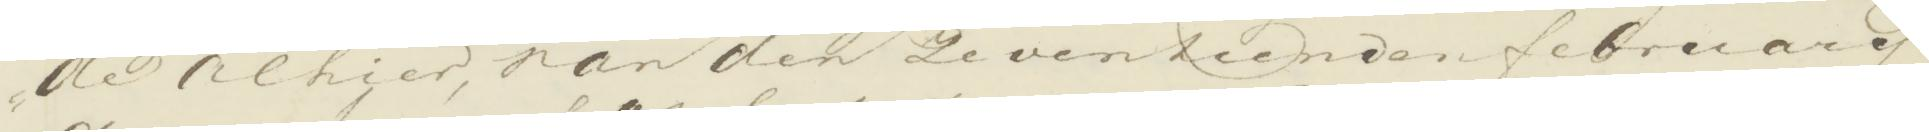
„de alhier, van den zeventienden februarij
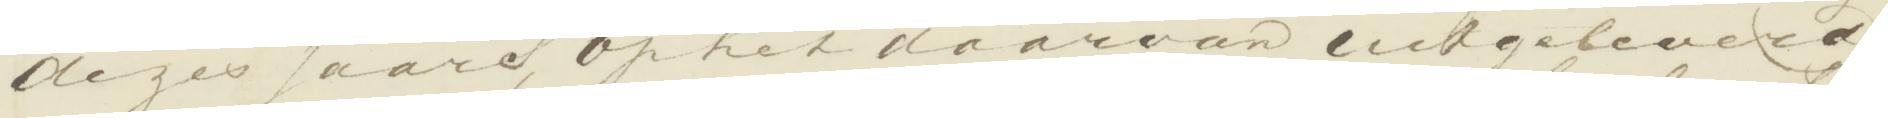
dezes Jaars, op het daarvan uitgeleverd
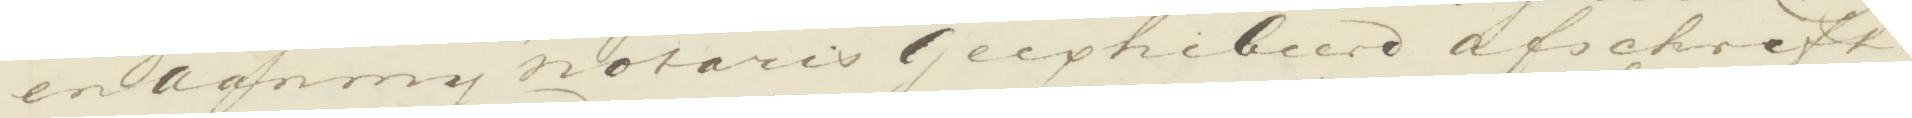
en aan my notaris Geexhibeerd afschrift
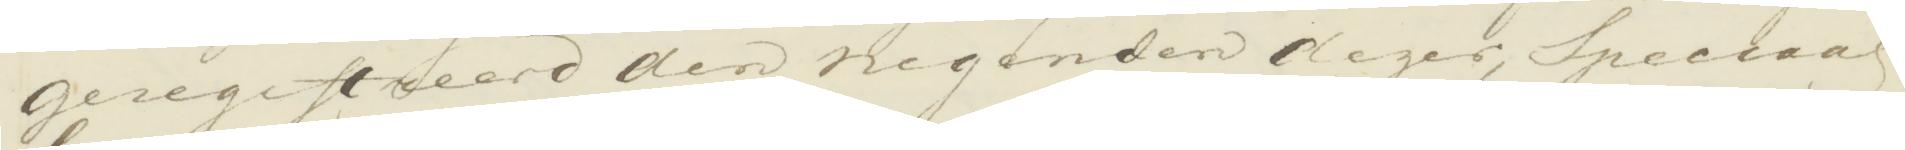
geregistreerd den negenden dezes, speciaal
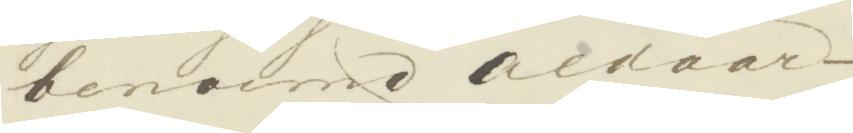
benoemd aldaar —
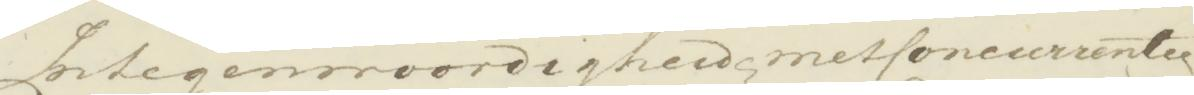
Integenwoordigheid met Concurrentie
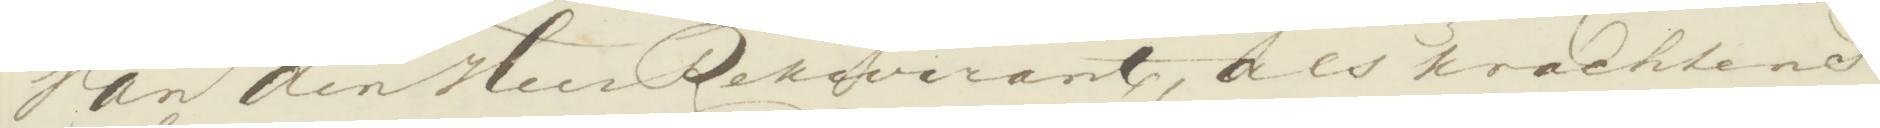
van den Heer Rekwirant, als krachtens
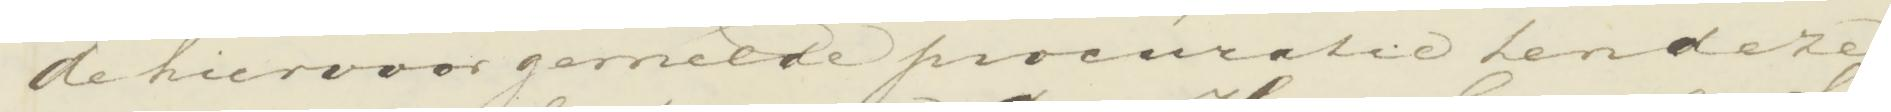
de hiervoor gemelde procuratie ten deze
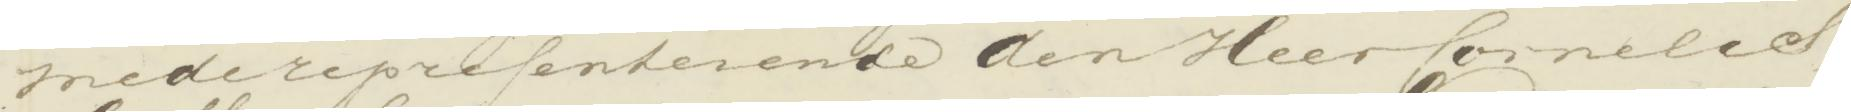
mede representerende den Heer Cornelis
